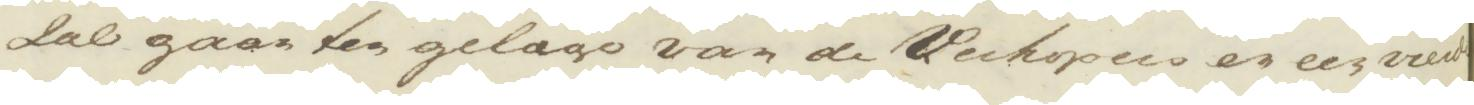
zal gaan ten gelage van de Verkopers en een vierde
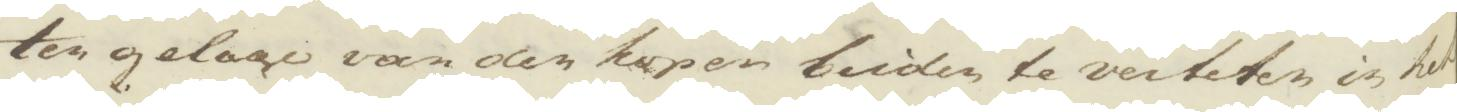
ten gelage van den koper beiden te verteten in het
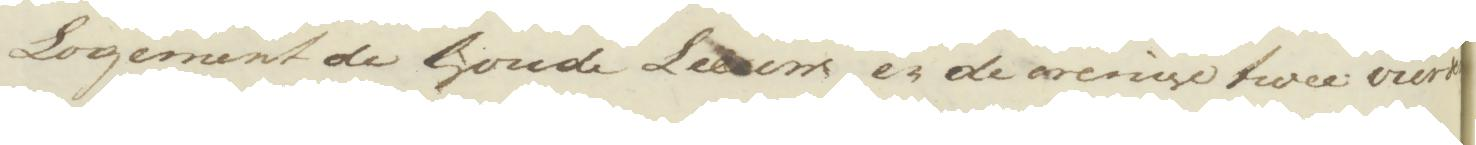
Logement de Goude Leeuw, en de overige twee vierde
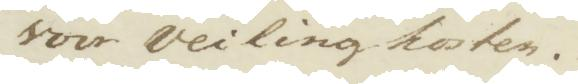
voor veiling kosten.
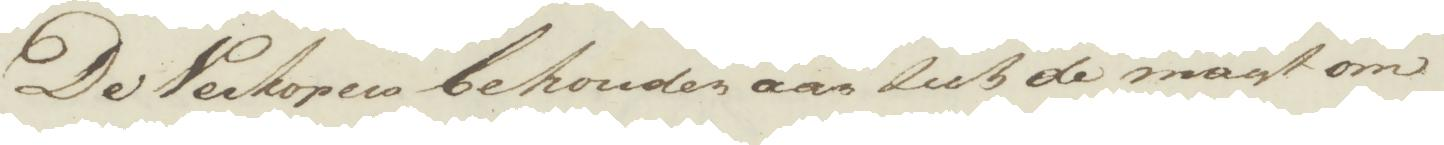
De Verkopers behouden aan zich de magt om
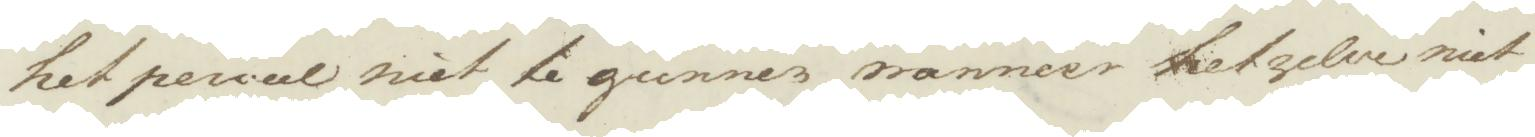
het perceel niet te gunnen wanneer hetzelve niet
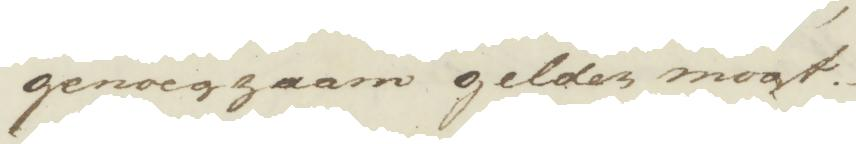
genoegzaam gelden mogt.
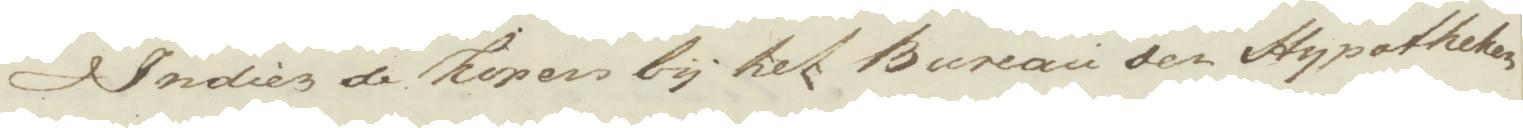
Indien de kopers bij het Bureau den Hypotheken
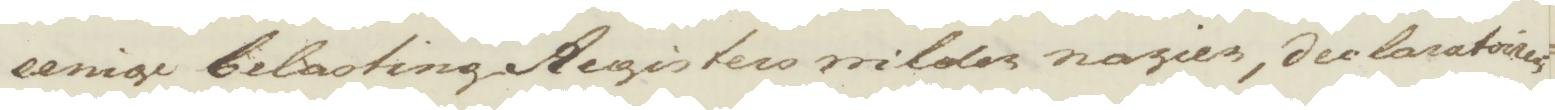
eenige belasting Registers wilden nazien, declaratoiren
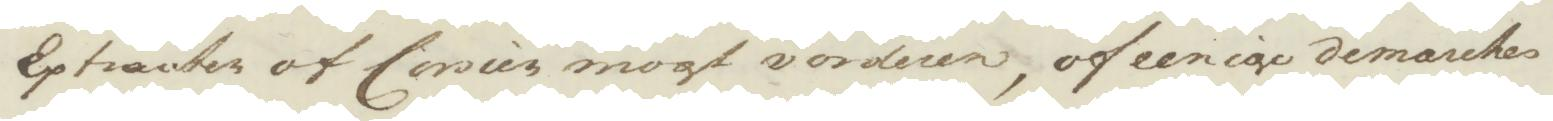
Extracten of Copien mogt vorderen, of eenige demarches
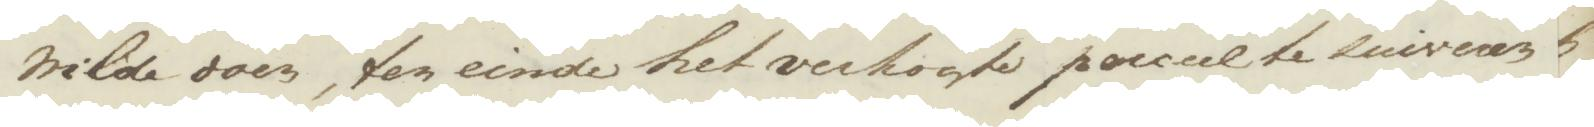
wilde doen, ten einde het verkogte perceel te Zuiveren
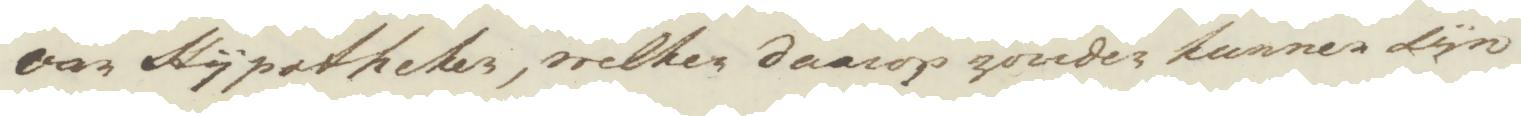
van Hijpotheken, welken daarop zouden kunnen zijn,
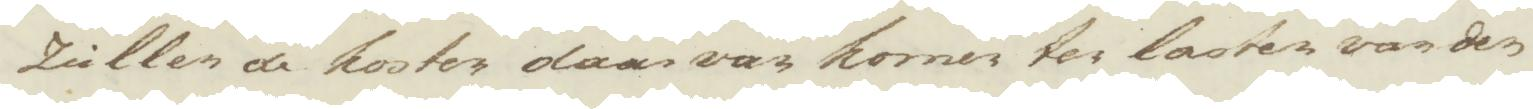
zullen de kosten daar van komen ten lasten van den
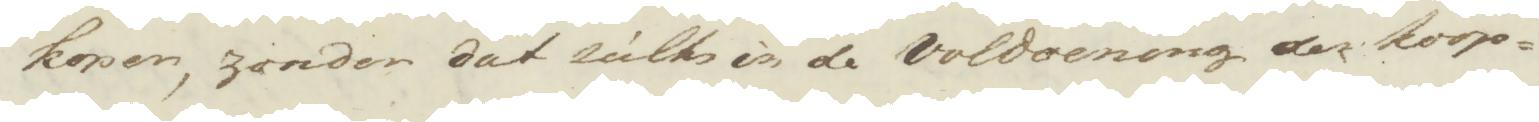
koper, zonder dat zulks in de voldoening der koop„
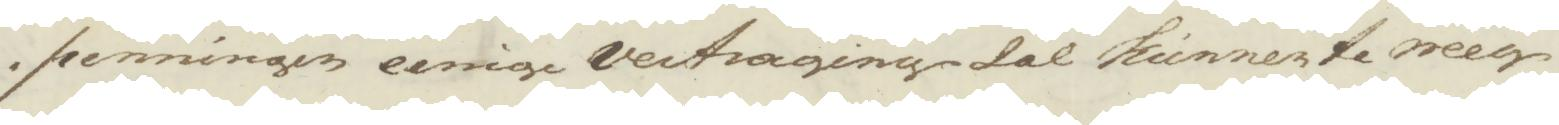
„penningen eenige vertraging zal kunnen te weeg
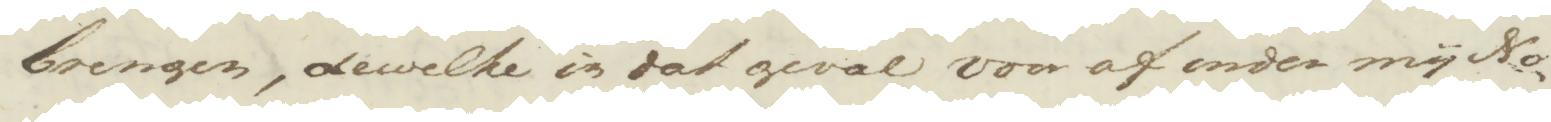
brengen, dewelke in dat geval voor af inder mij No„
